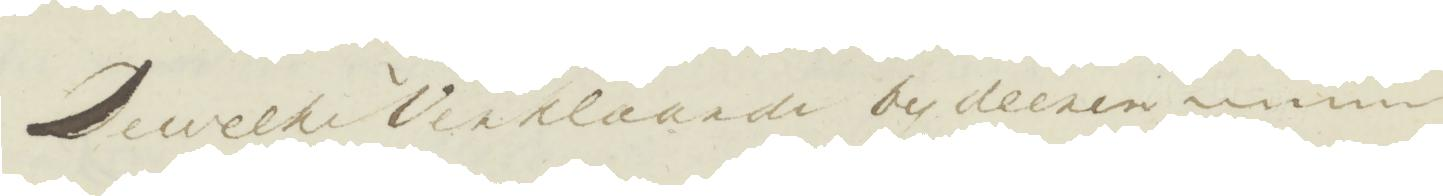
Dewelke verklaarde by deezen
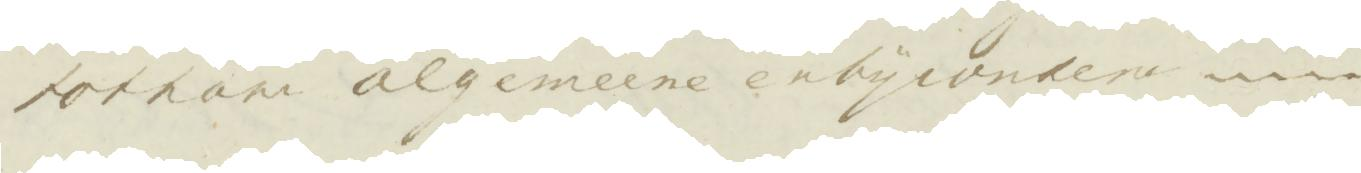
tot hare algemeene en bijzondere
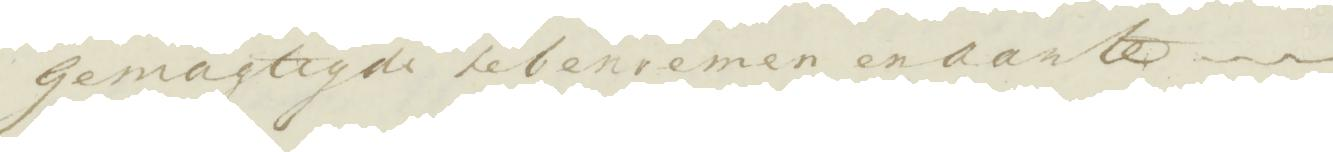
Gemagtigde te benoemen en aan te
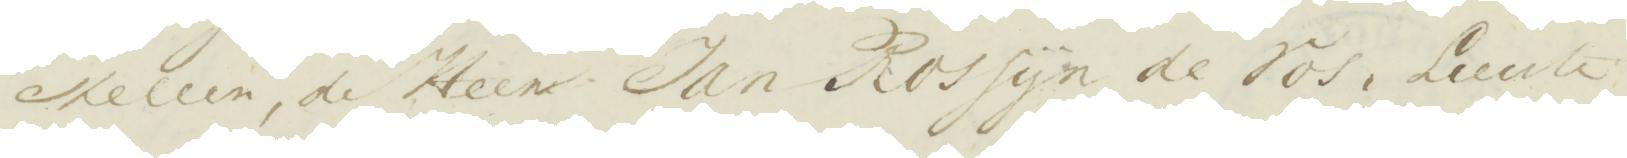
stellen, de Heer Jan Rossijn de Vos, Lieute
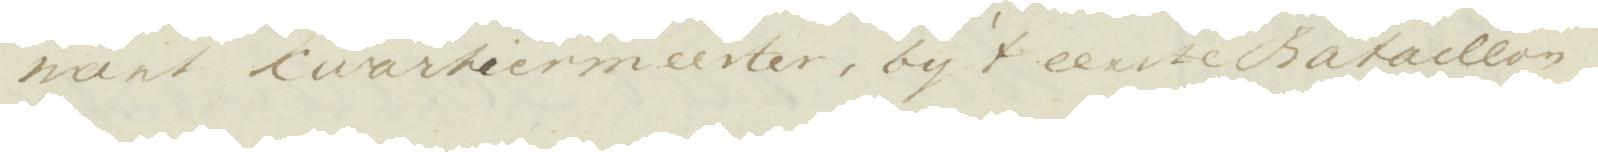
nant kwartiermeester, by 't eerste Bataillon
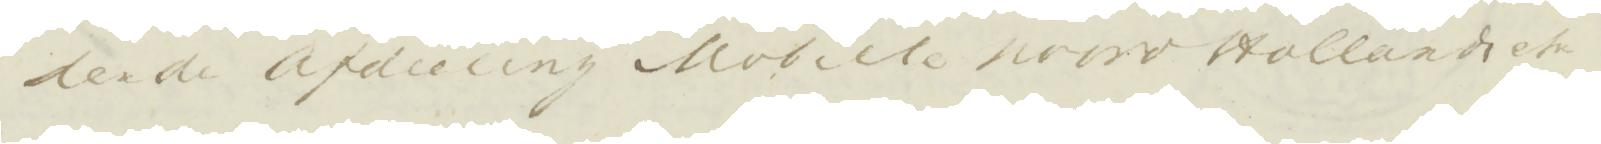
derde afdeeling Mobiele noord Hollandsche
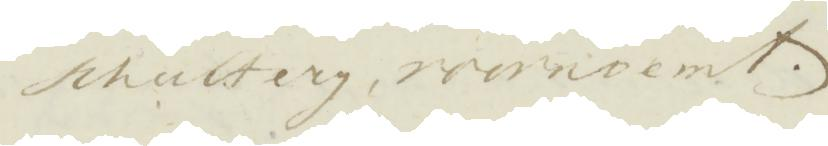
schuttery, voornoemt.
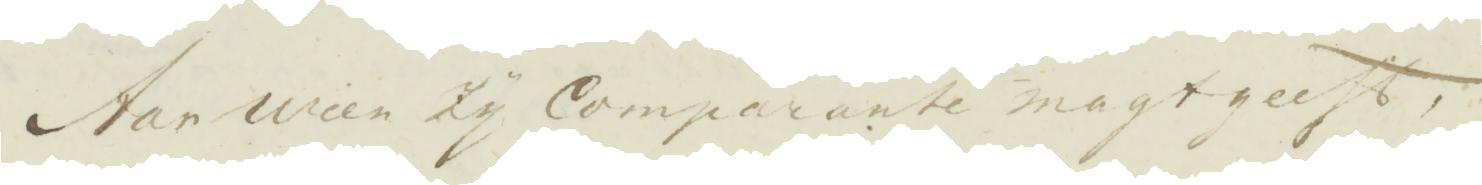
Aan wien zij Comparante magt geeft,
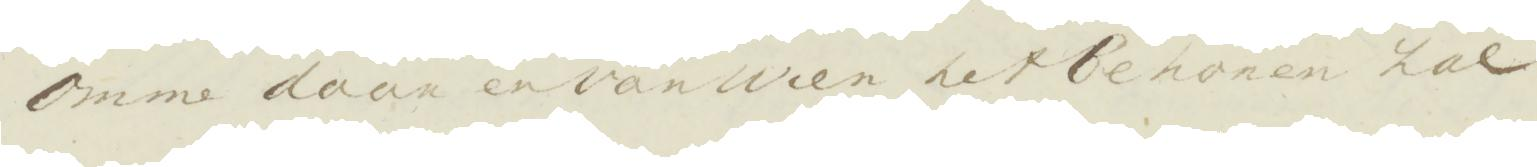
omme daar en van wien het behoren zal
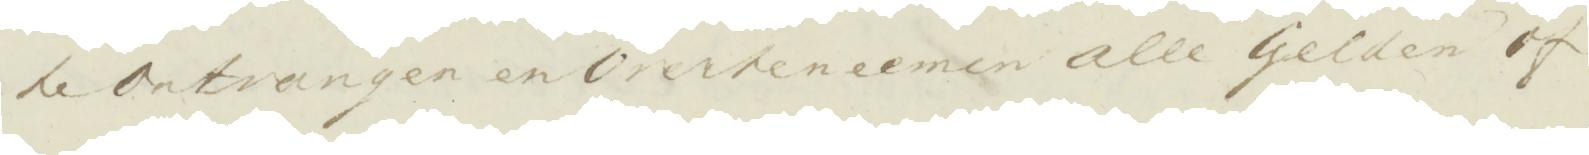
te ontvangen en overteneemen alle Gelden of
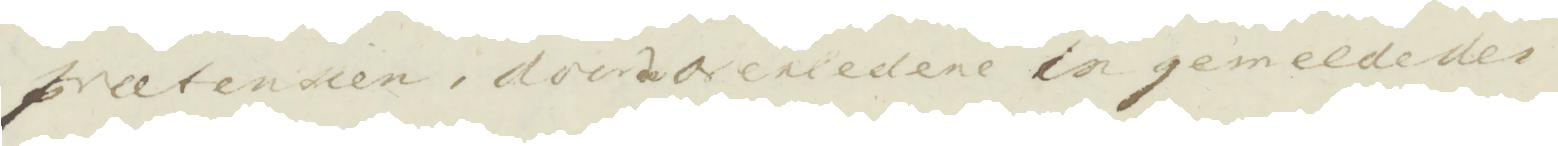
preetensien, door de overledene in gemelde des
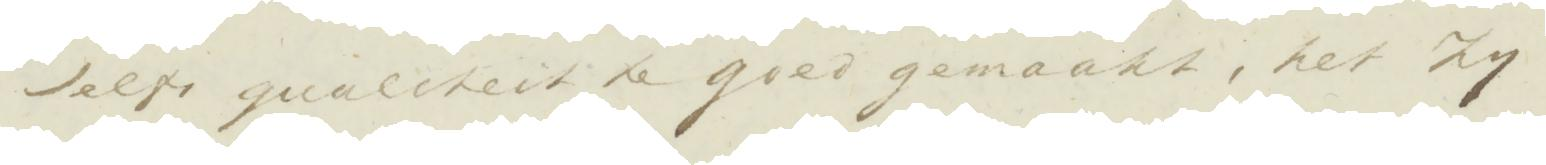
selfs qualiteit te goed gemaakt, het zy
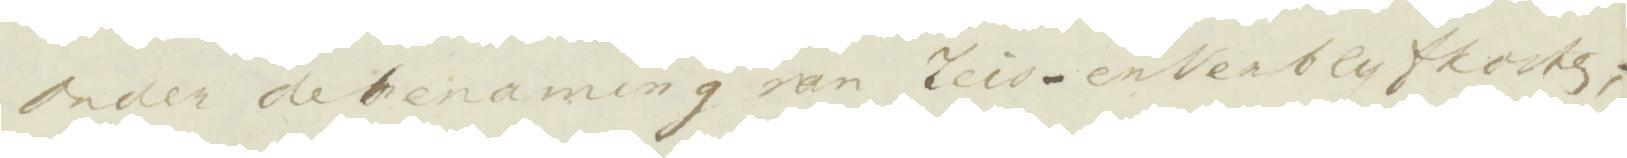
onder de benaming van reis-en verblyfkosten,
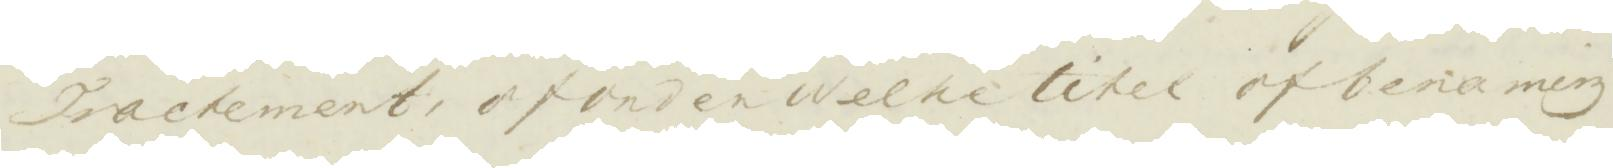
Tractement, of onder welke titel of benamen
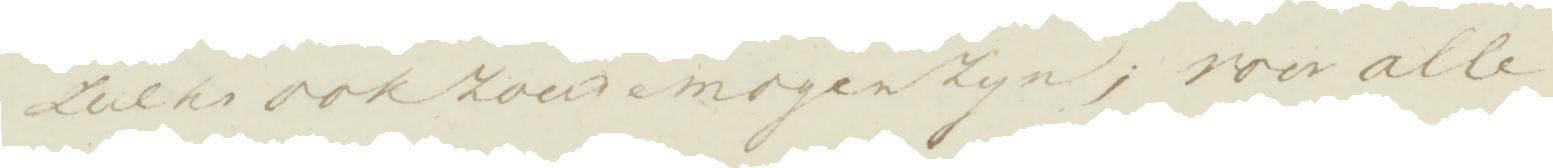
zulks ook zoude mogen zyn; voor alle
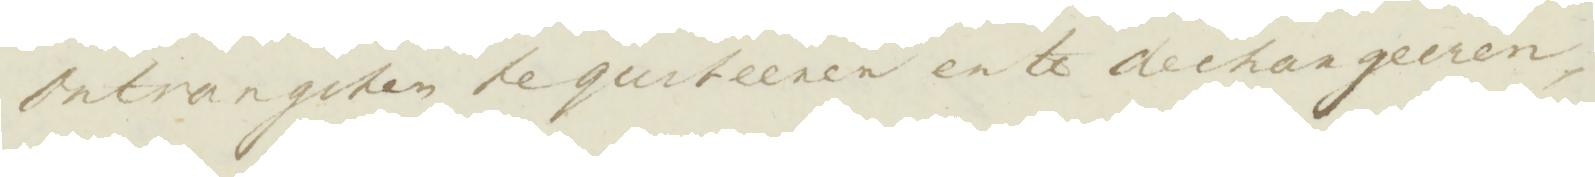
ontvangsten te quiteeren en te dechargeeren,
